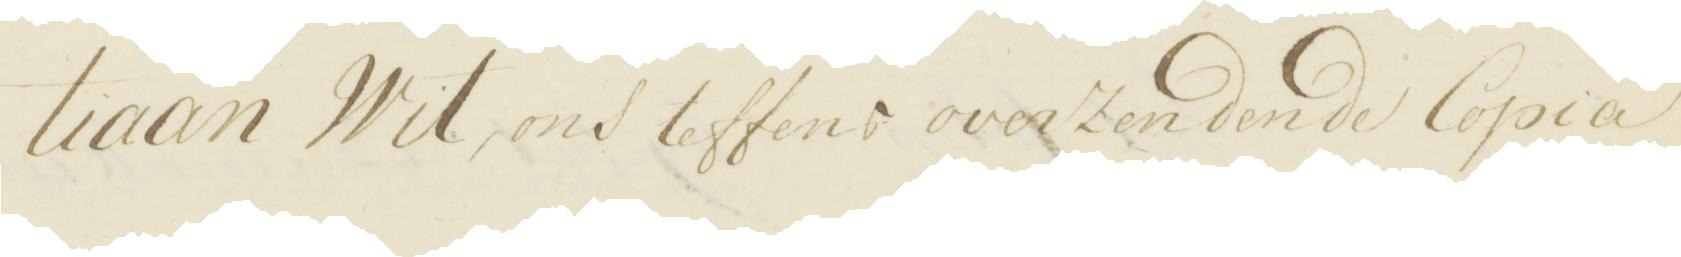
tiaan Wit, ons teffens over zendende Copia
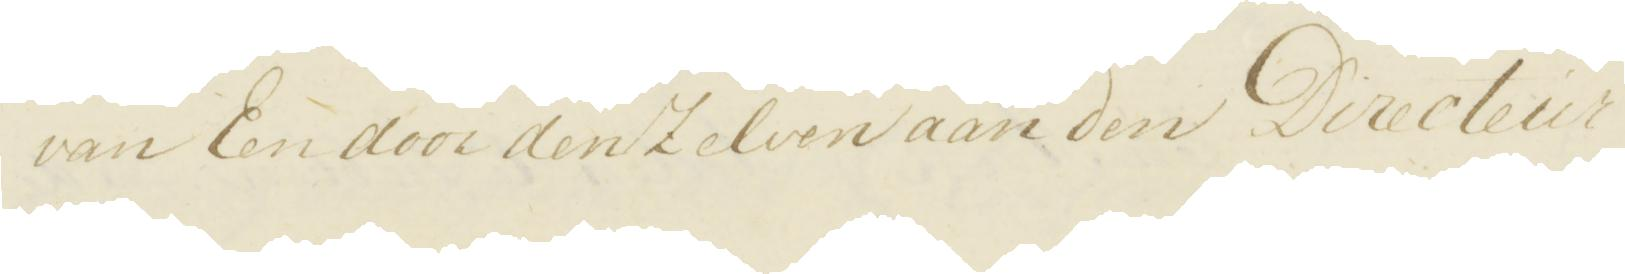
van Een door denzelven aan den Directeur
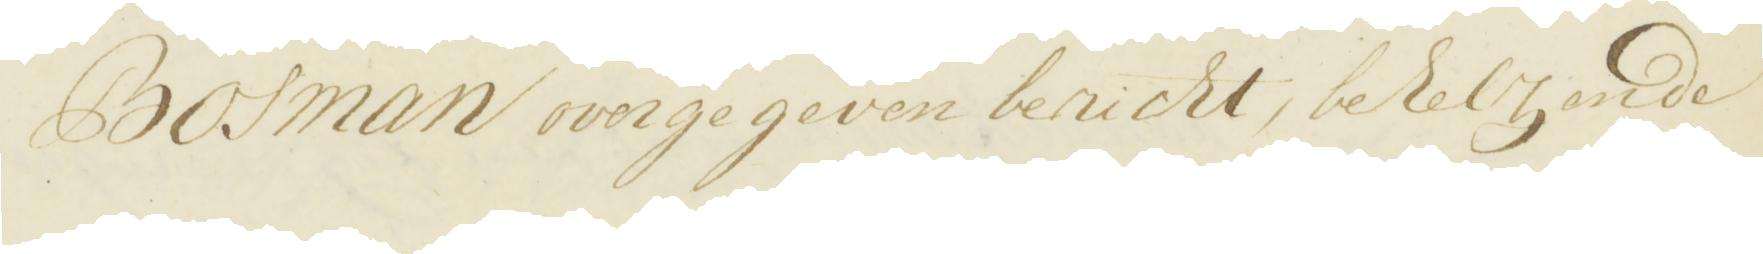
Bosman overgegeven bericht, behelzende
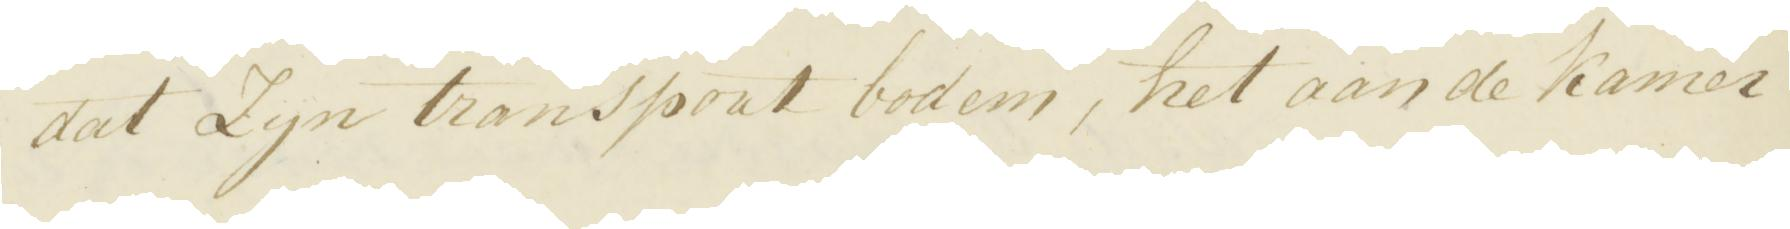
dat zijn transport bodem, het aan de kamer
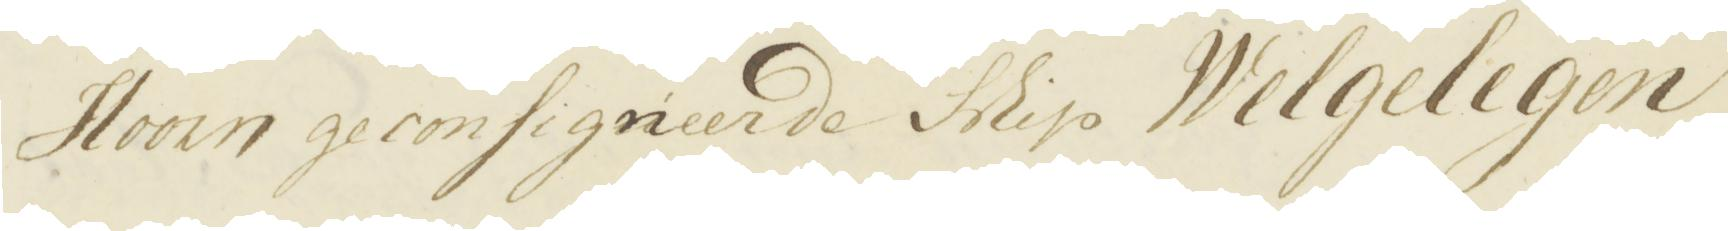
Hoorn geconsigneerde schip Welgelegen,
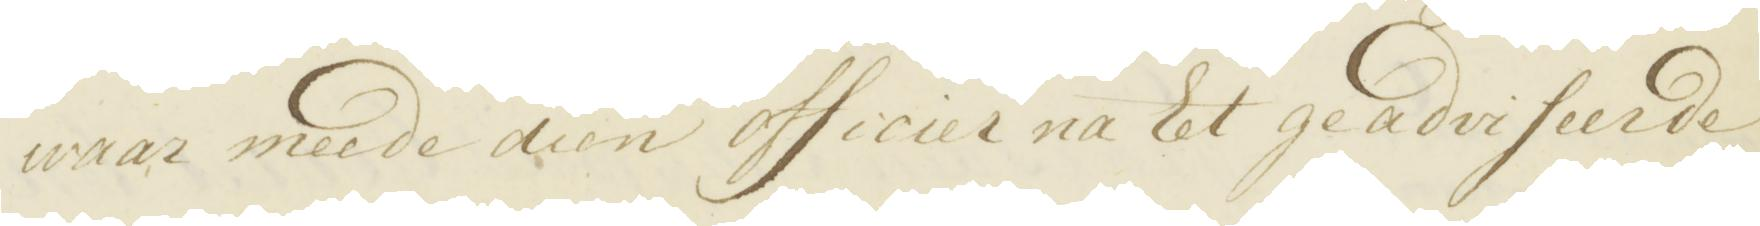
waar meede dien officier na het geadviseerde
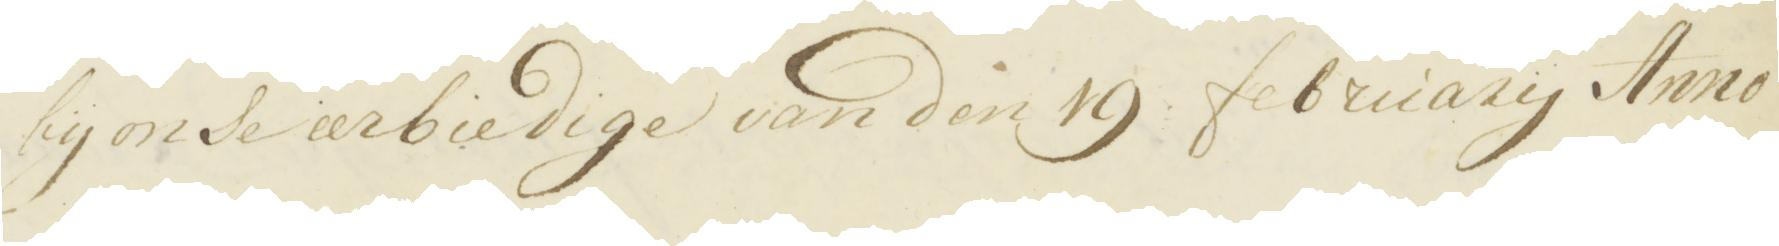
bij onse eerbiedige van den 19. februarij Anno
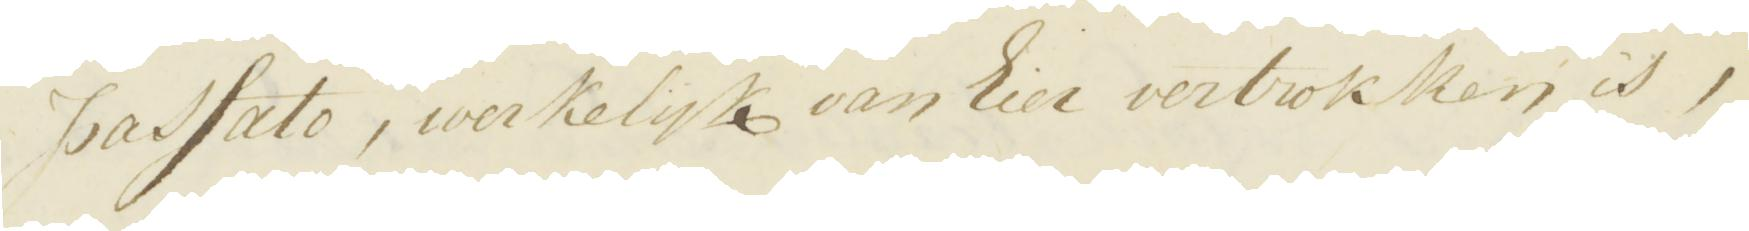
passato, werkelijk van hier vertrokken is,
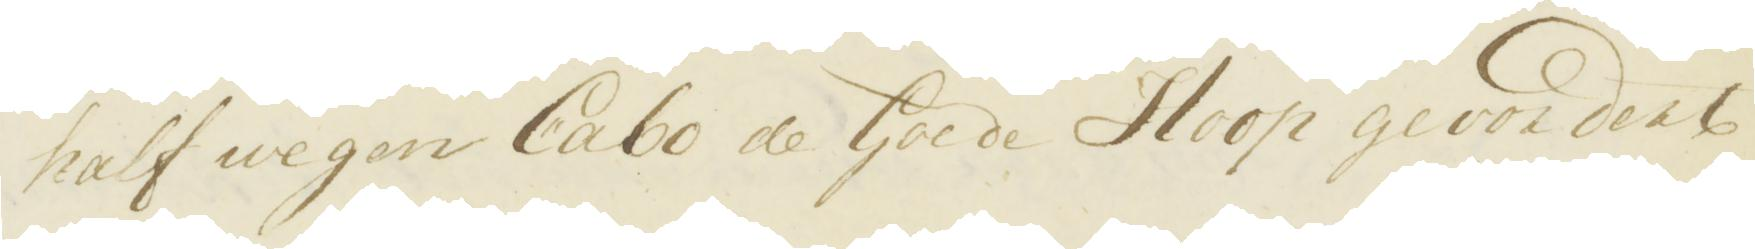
half wegen Cabo de Goede Hoop gevordert
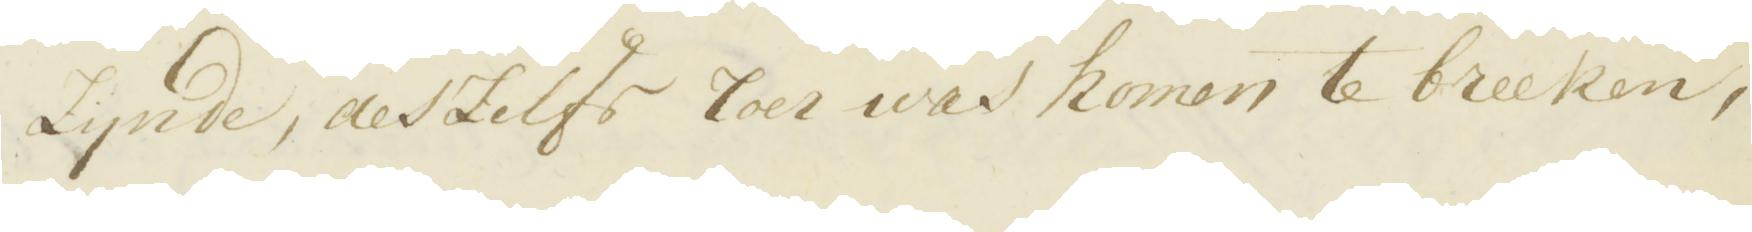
Zijnde, des zelfs toer was komen te breeken,
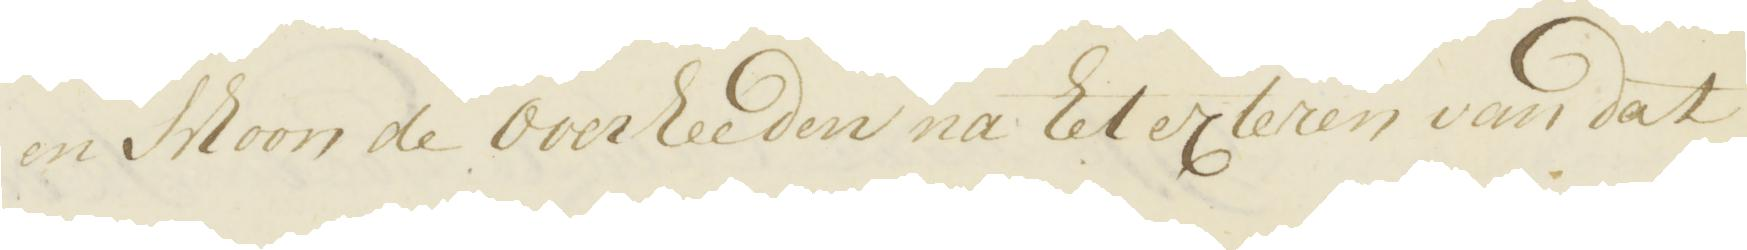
en schoon de overheeden na Eterteren van dat
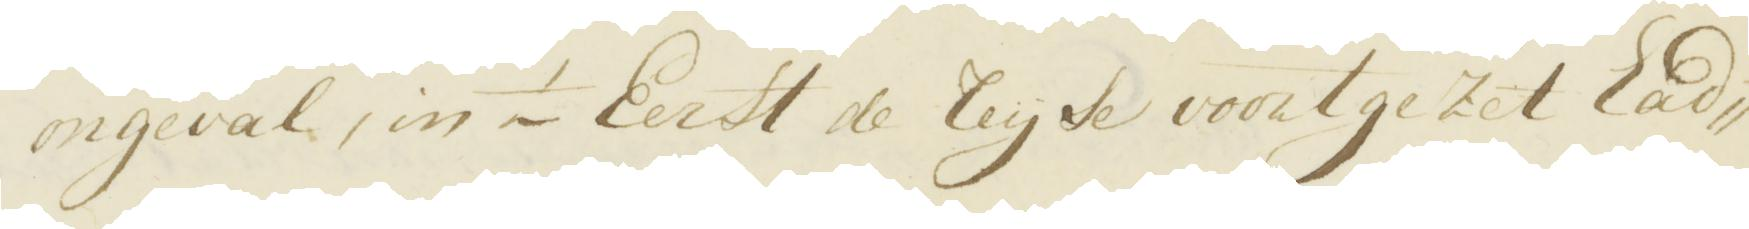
ongeval, in t Eerst de reijse voortgezet had„
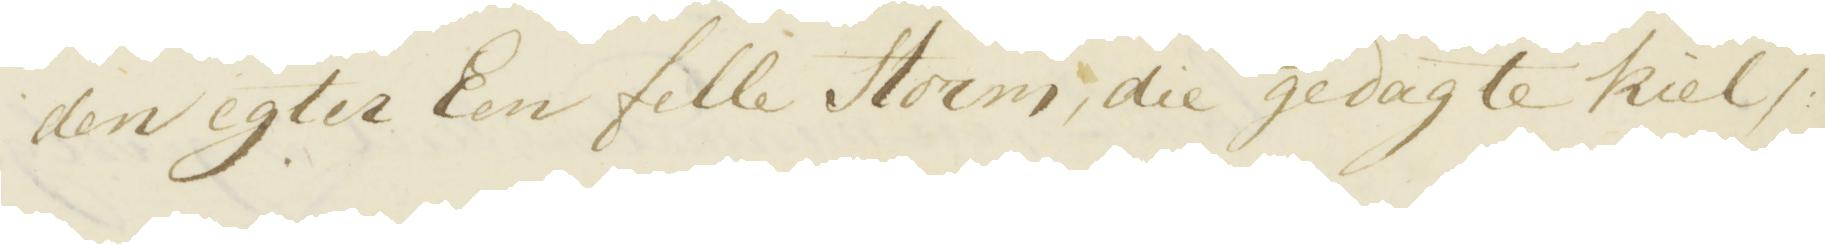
den egter Een felle Storm, die gedagte kiel /:
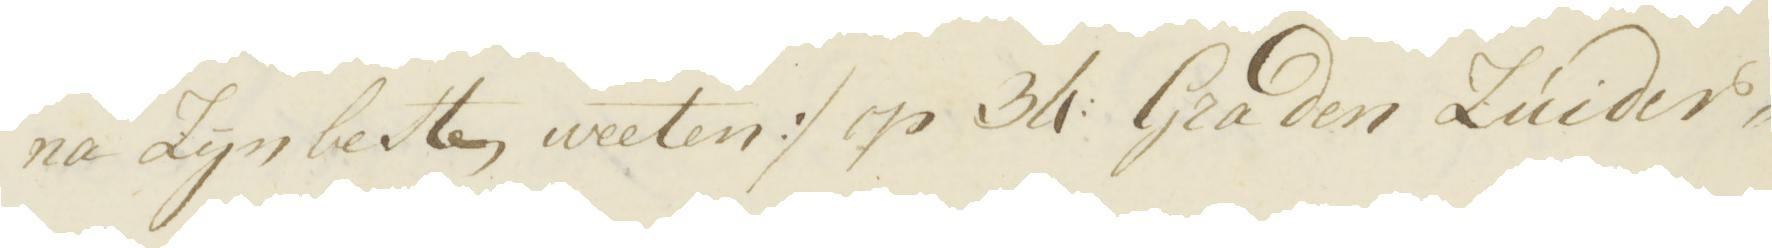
na Zijn besten weeten:/ op 34: Graden Zuider„
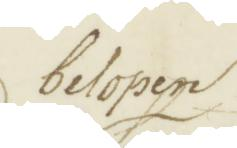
belopen
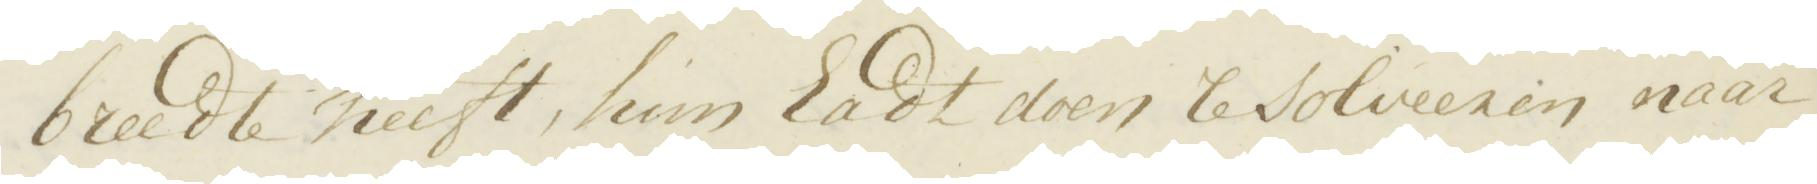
breedte heeft, hun hadt doen resolveeren naar
